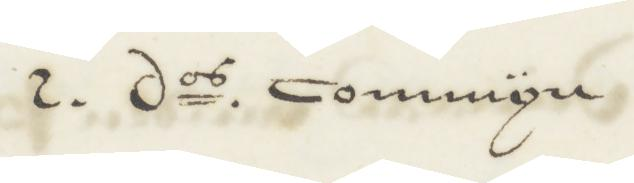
2. d=os. commijn
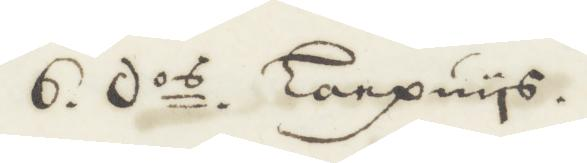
6. d=os. harpuijs.
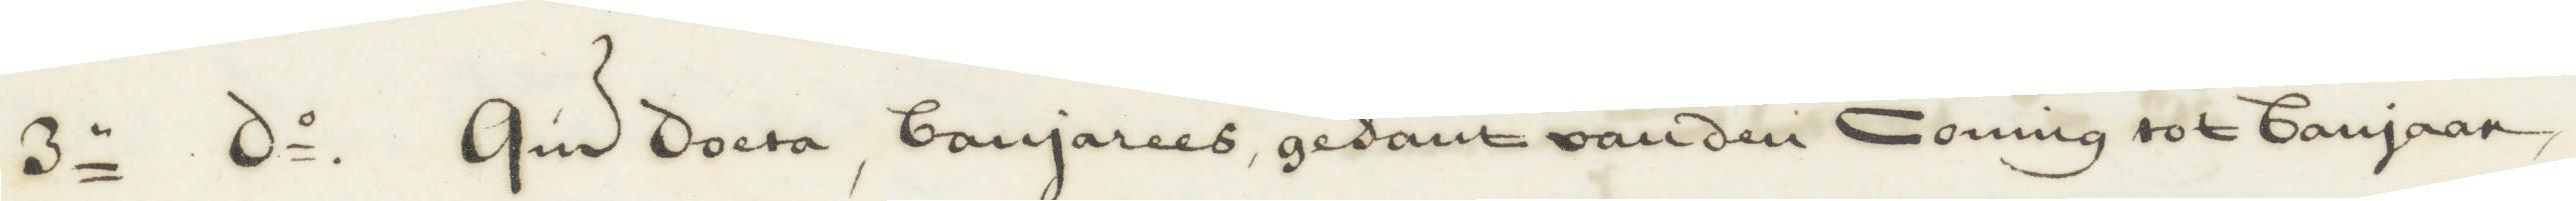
3=' d=o. Que doeta, banjarees, gesant van den coning tot banjaar,
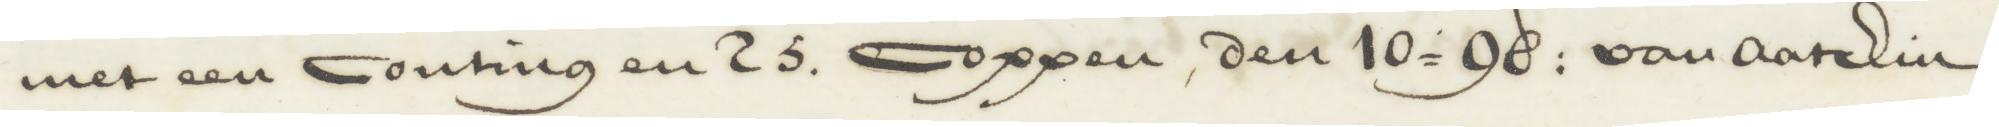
met een conting en 25. coppen, den 10=' 9b: van aatchin
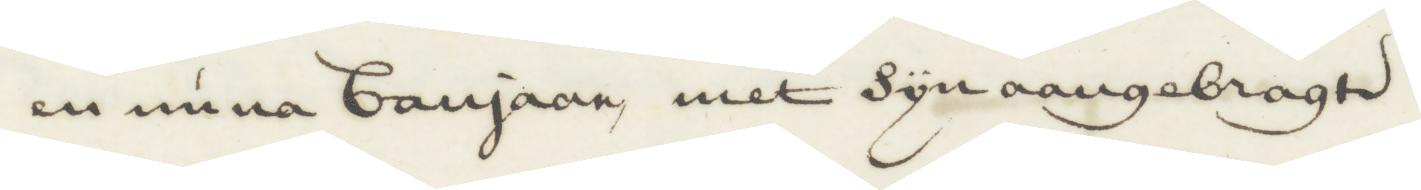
en nuna banjaar, met sijn aangebragte
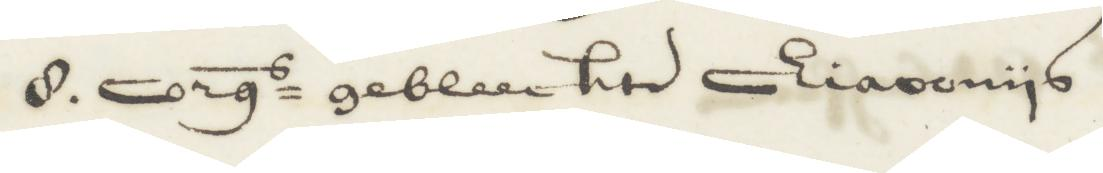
8. corg=s gebleeckte chiavonijs
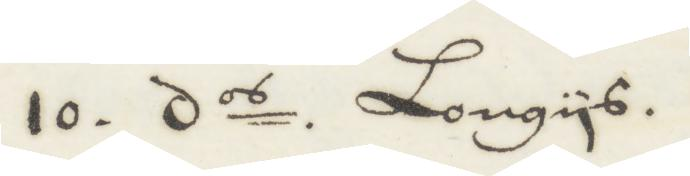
10. d=os. Longijs.
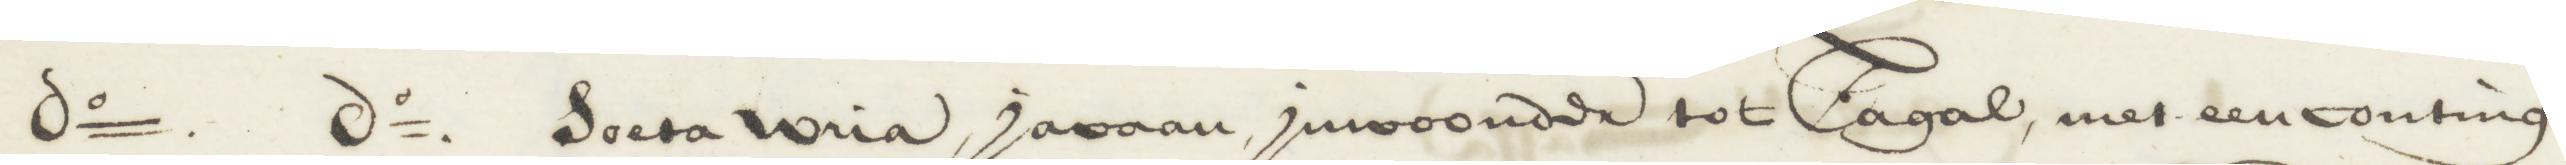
d=o. d=o. soeta wria, javaan, jnwoonder tot Tagal, met een conting
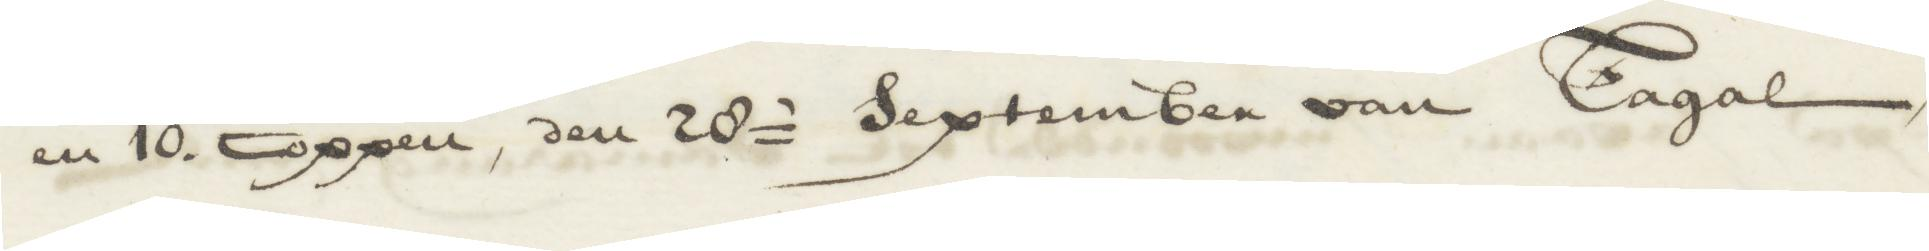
en 10. coppen, den 28=' september van Tagal
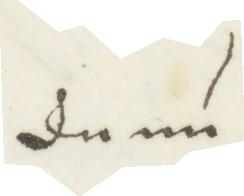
En nu
